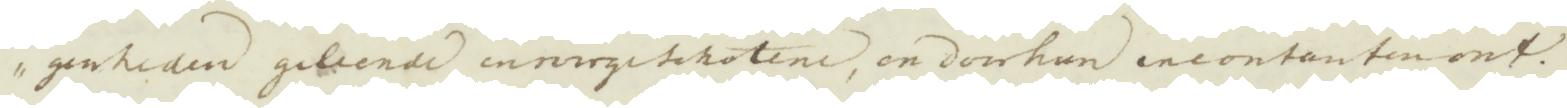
„genheden geleende en voorgeschotene, en door hun in contanten ont.
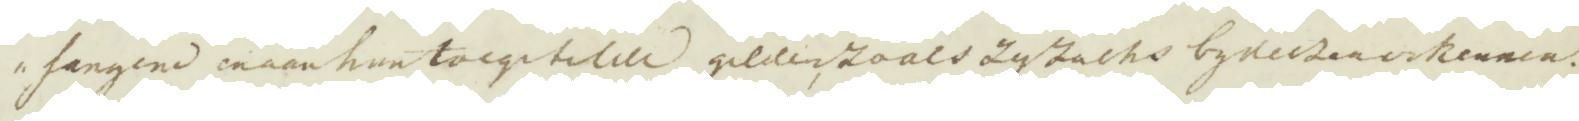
„fangene en aan hun toegetelde gelden, zoals zy zachs by deezer erkennen
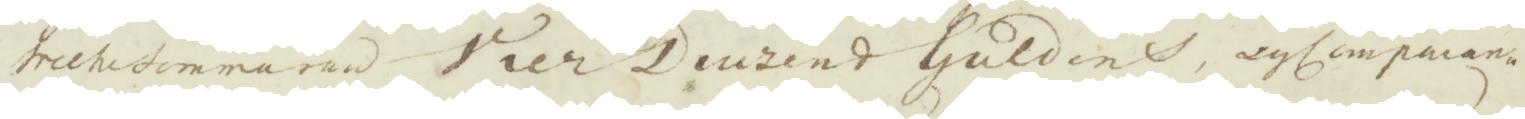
Welke somma van Vier Duizend Guldens, zy Comparan„
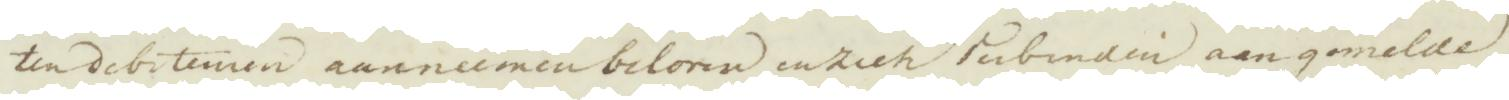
ten debiteeren aanneemen en zich verbinden aan gemelde
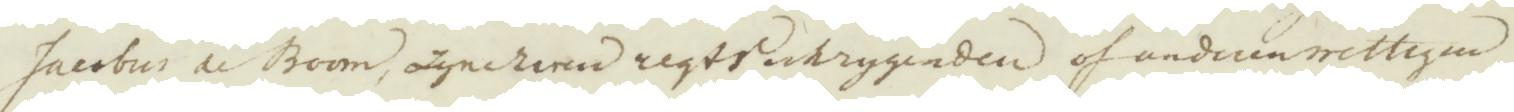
Jacobus de Boom, zyne Eer en regt Verkrygenden of anderen wettigen
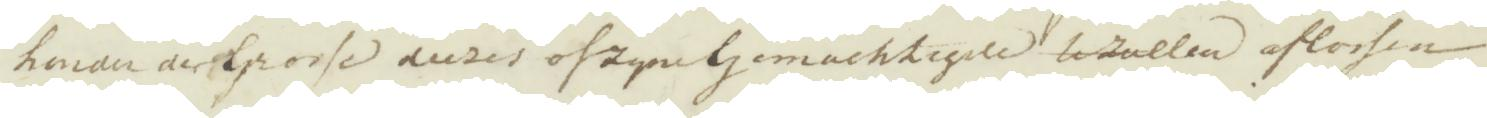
houder der Gosse deezes of zyne Gemachtigde te zullen aflossen
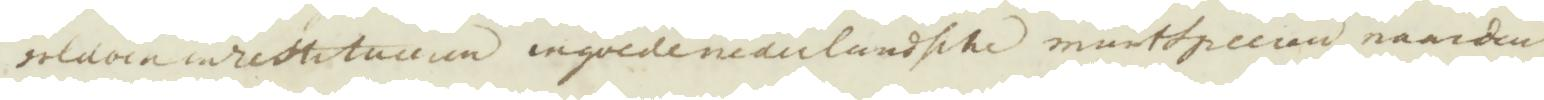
voldoen en restitueeren in goede nederlandsche muntspecien, naar den
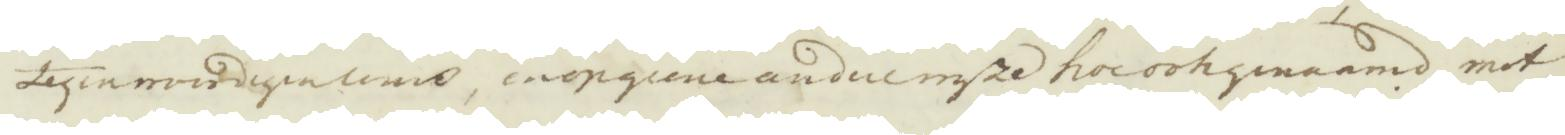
tegenwoordigen want, en op geene andere wyze hoe ook genaamd, met
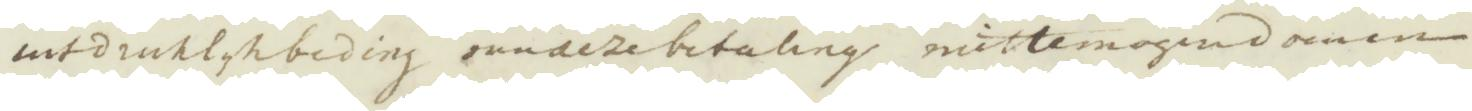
uitdruklyk beding van deze betaling niettemogen doen in
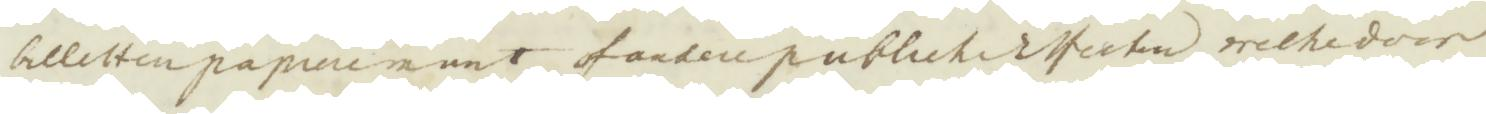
billetten papieren munt of ander publieke Effecten, welke door
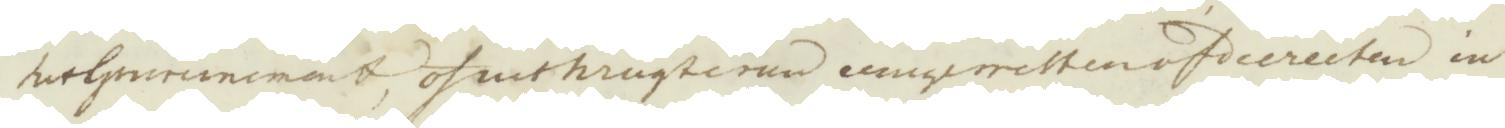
het Gouvernement, of uit kragte van eenige wetten of decreeten in
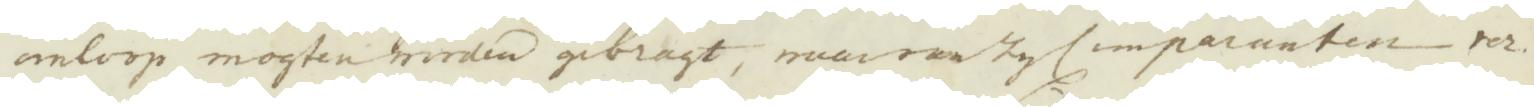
omloop mogten worden gebragt, waarvan zy Comparanten ver
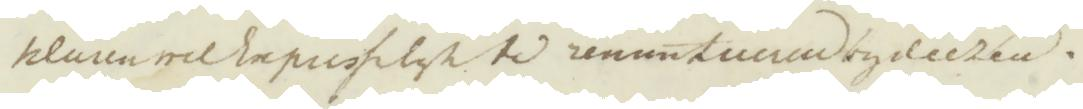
klaren we Expresselyk te renuntieeren by deezen.
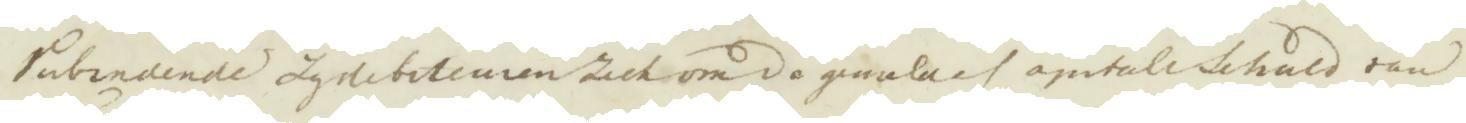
Verbindende zy debiteuren zich om de gemelde Capitale schuld van
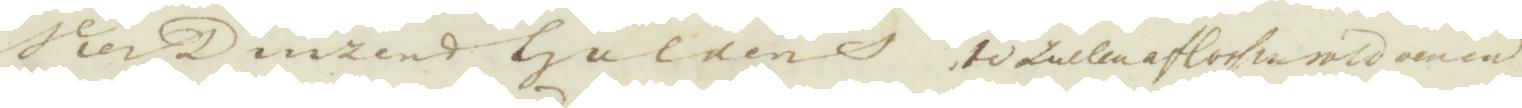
Vier Duizend Guldens, te zullen aflossen voldoen en
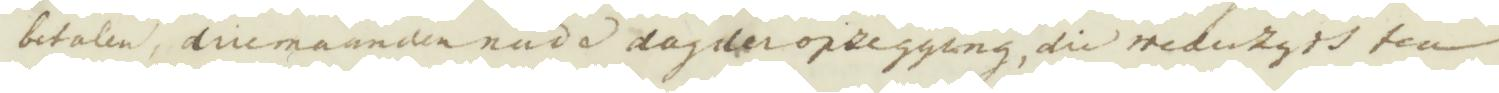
betalen, drie maanden na de dag der opzegging, die wederzyds ten
